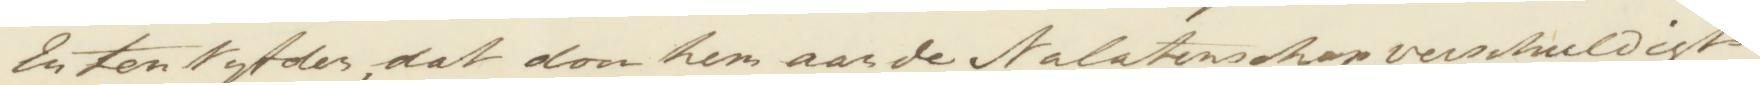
En ten Vyfden, dat door hem aan de Nalatenschap verschuldigt
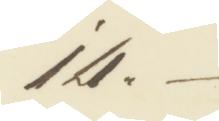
14„ —
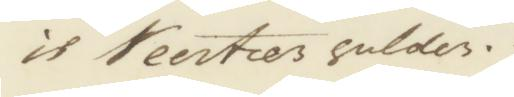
is Veertien gulden.
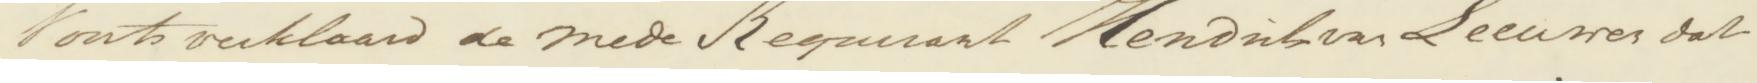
Voorts verklaard de mede Requirant Hendrik van Leeuwen dat
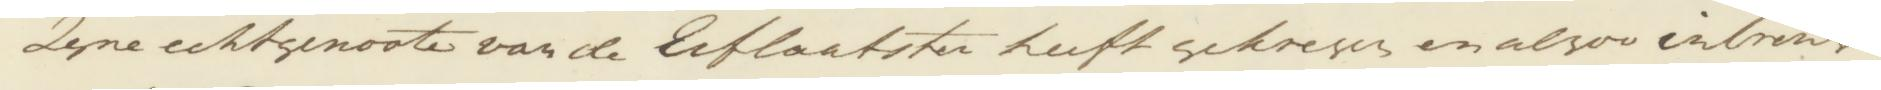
zyne echtgenoote van de Erflaatster heeft gekregen en alzoo inbreng
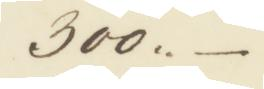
300„ —
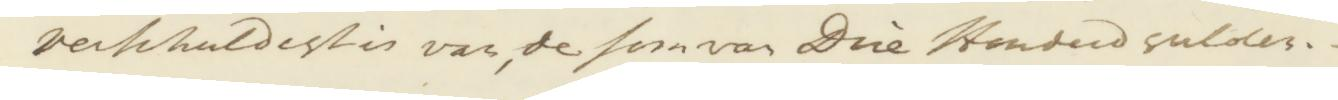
verschuldigt is van, de som van Drie Honderd gulden.
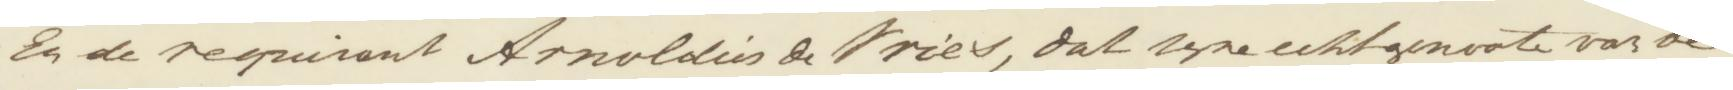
En de requirent Arnoldus de Vries, dat zyne echtgenoote van de
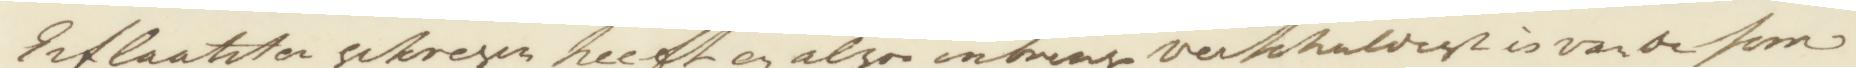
Erflaatster gekregen heeft en alzoo inbrenge verschuldigt is van de som
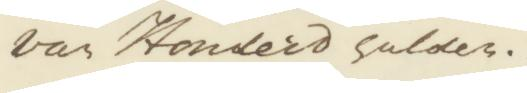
van Honderd gulden.
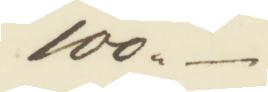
100„ —
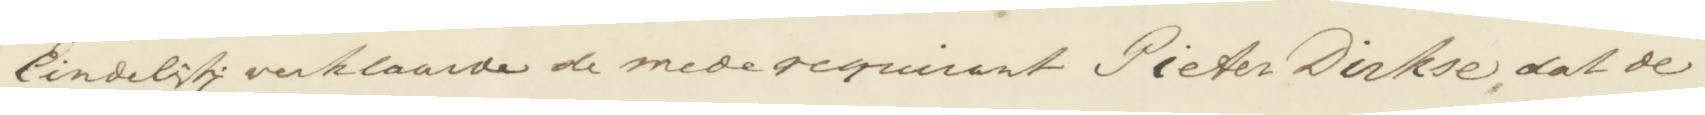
Eindelijk verklaarde de mede requirent Pieter Dirkse, dat de
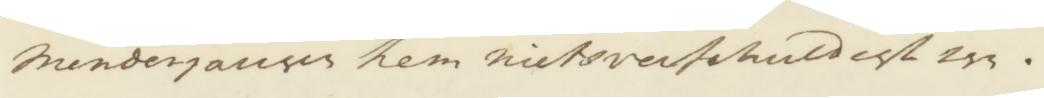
minderjarigen hem niets verschuldigt zyn.
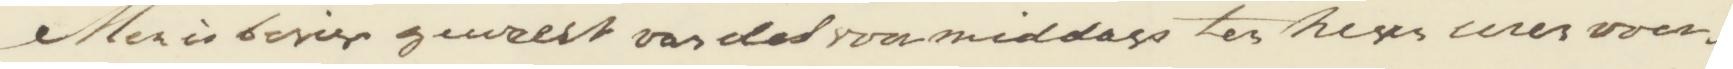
Men is bezig geweest van des voormiddags ten negen uren voor„
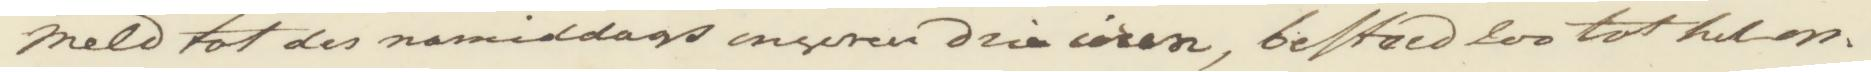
meld tot des namiddags ongeveer drie uren, besteed zoo tot het op
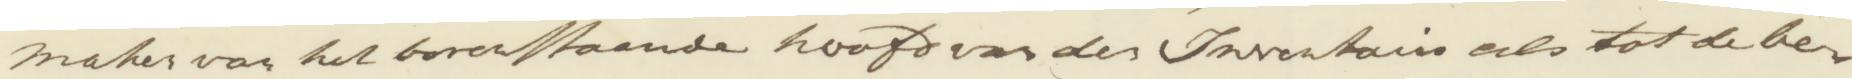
maken van het bovenstaande hoofd van den Inventaris als tot de be
